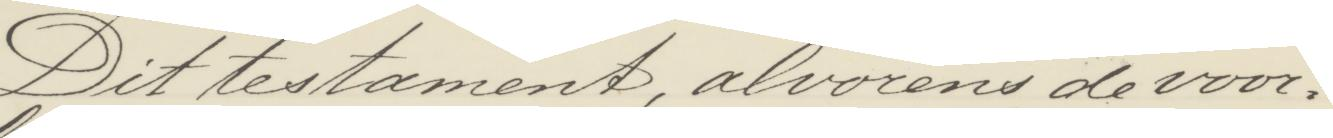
Dit testament, alvorens de voor=
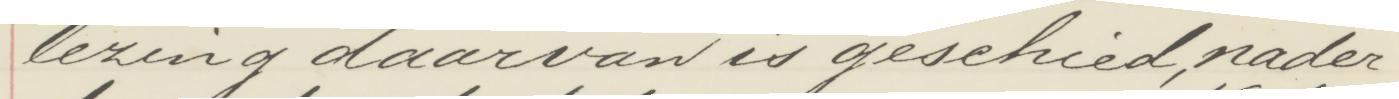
lezing daarvan is geschied, nader
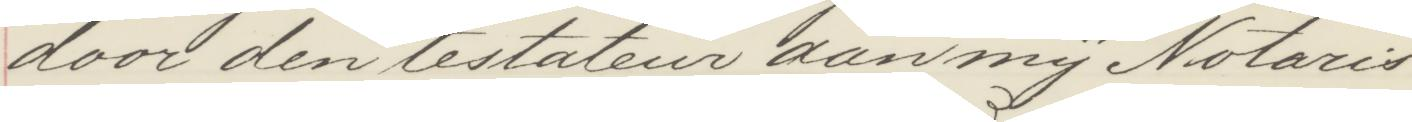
door den testateur aan mij Notaris
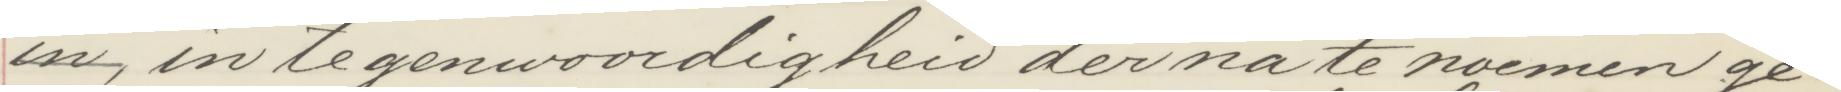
in, in tegenwoordigheid der na te noemen ge-
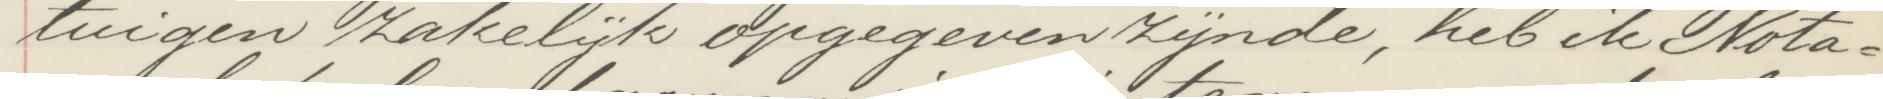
tuigen zakelijk opgegeven zijnde, heb ik Nota=
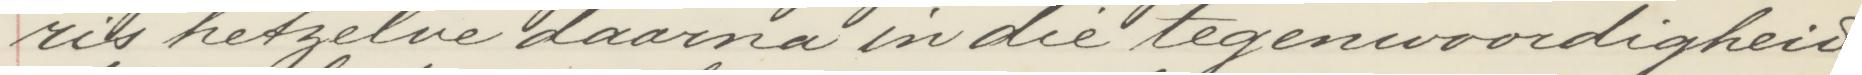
ris hetzelve daarna in die tegenwoordigheid
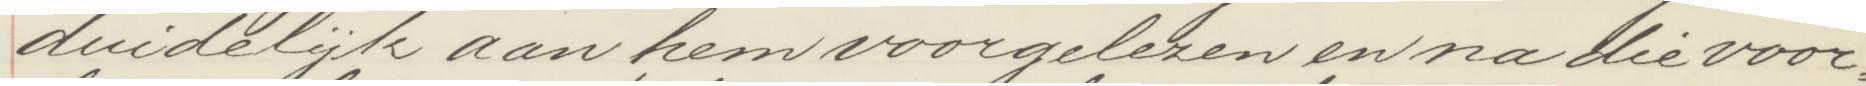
duidelijk aan hem voorgelezen en na die voor=
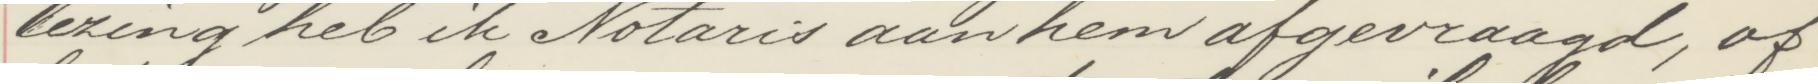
lezing heb ik Notaris aan hem afgevraagd, of
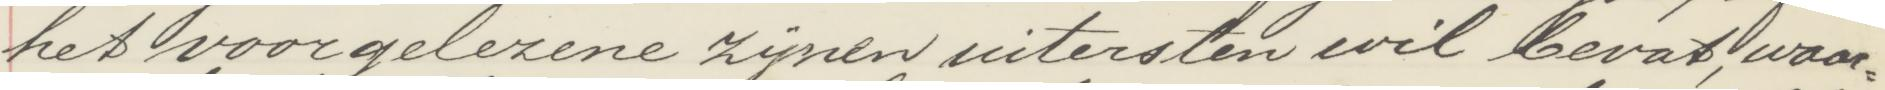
het voorgelezene zijnen uitersten wil bevat, waar„
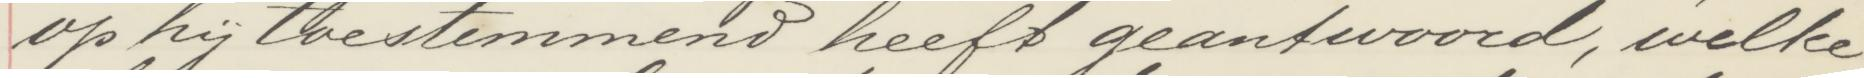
op hij toestemmend heeft geantwoord, welke
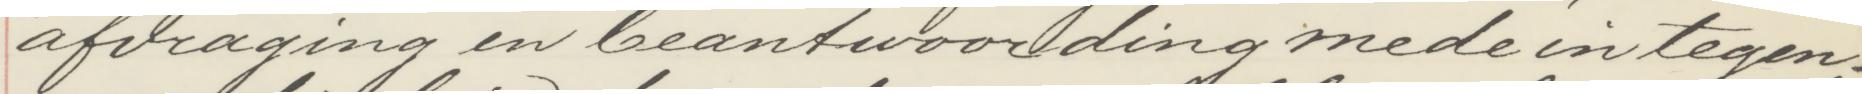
afvraging en beantwoording mede in tegen-
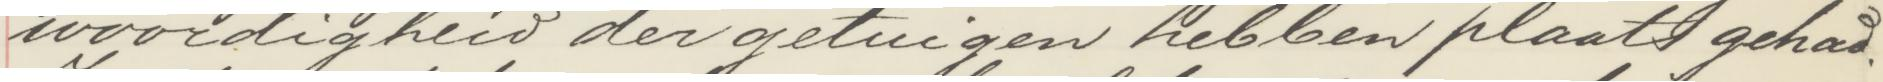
woordigheid der getuigen hebben plaats gehad.
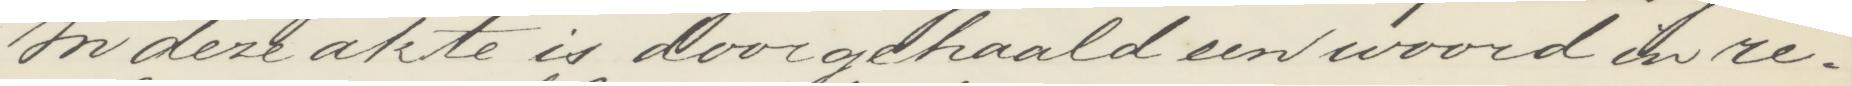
In deze akte is doorgehaald een woord in re„
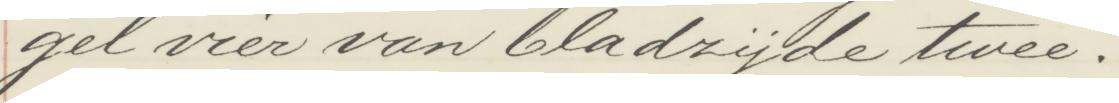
gel vier van bladzijde twee.
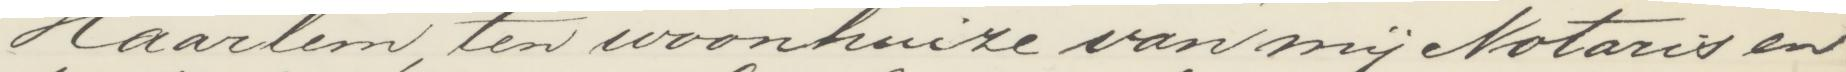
Haarlem, ten woonhuize van mij Notaris en
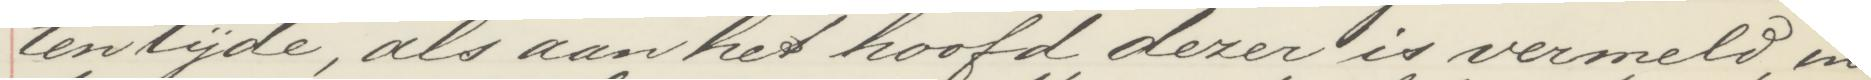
ten tijde, als aan het hoofd dezer is vermeld, in
